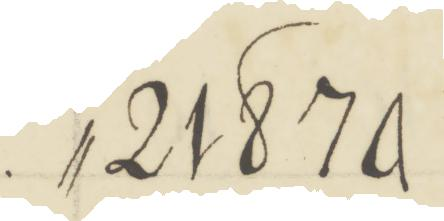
„21874.
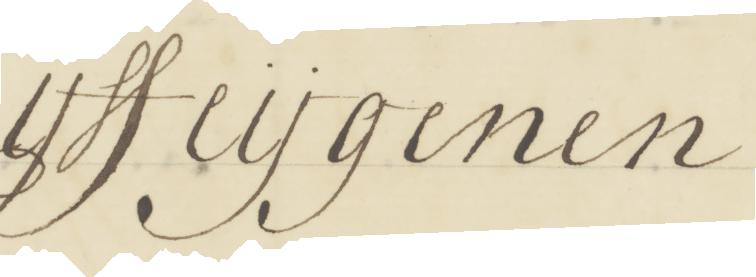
ijffeijgenen
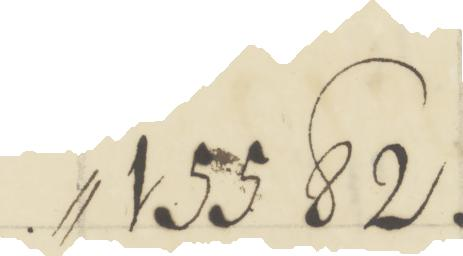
„15582.
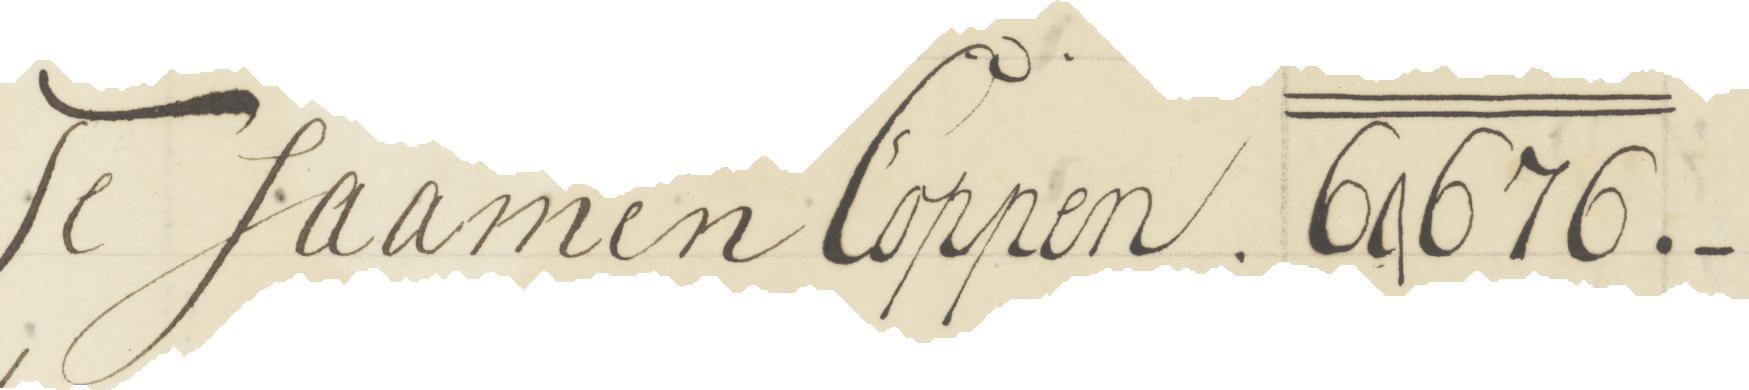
Te saamen Coppen. 64676._
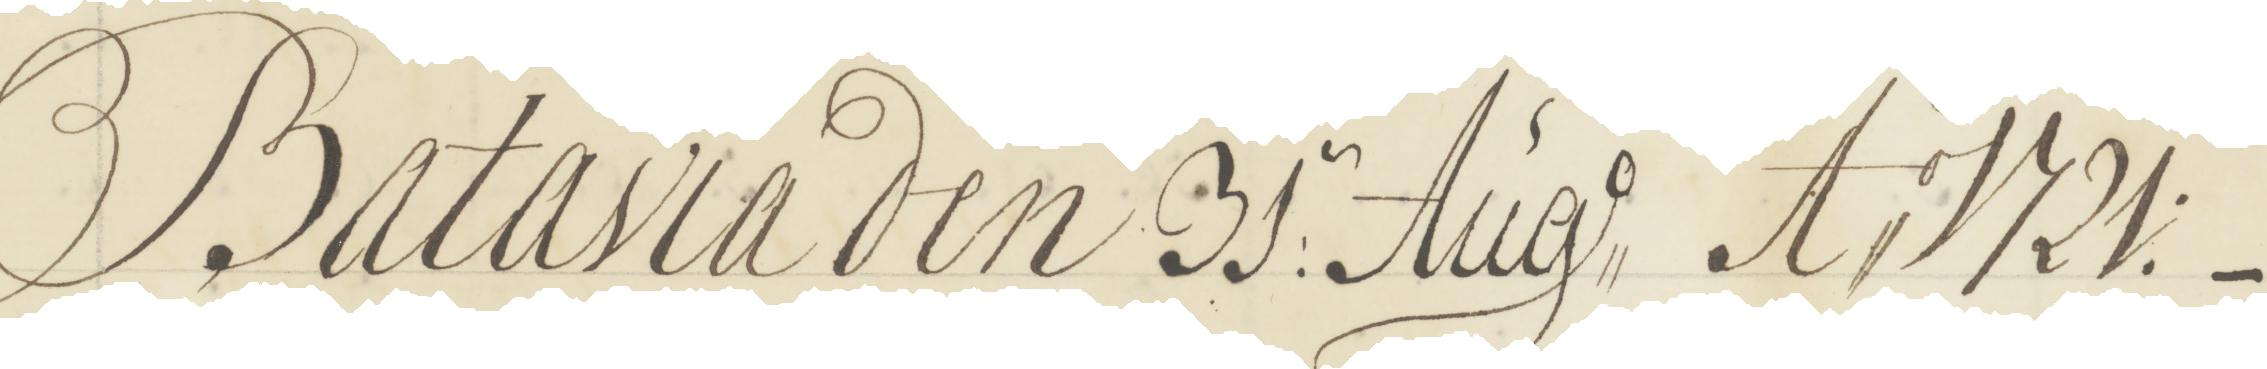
Batavia den 31: Aug„o A„o 1721:_
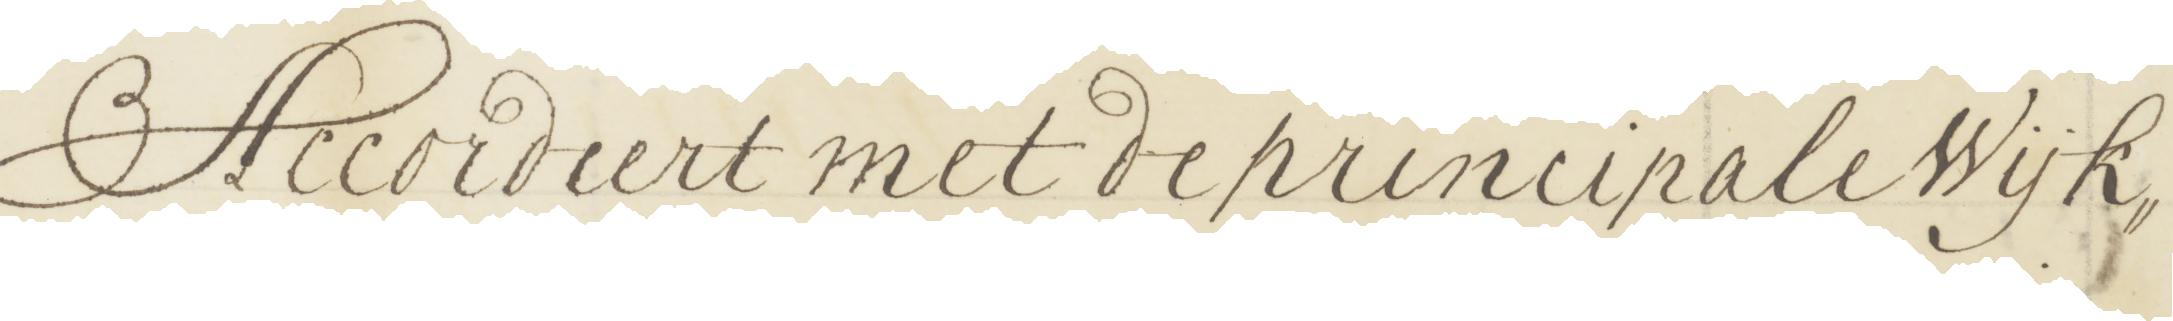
Accordeert met de principale Wijk„
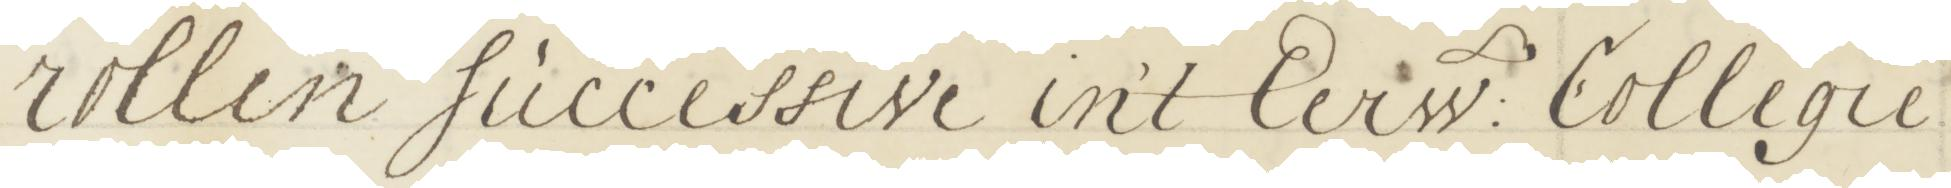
rollen successive in’t Eerw: Collegie
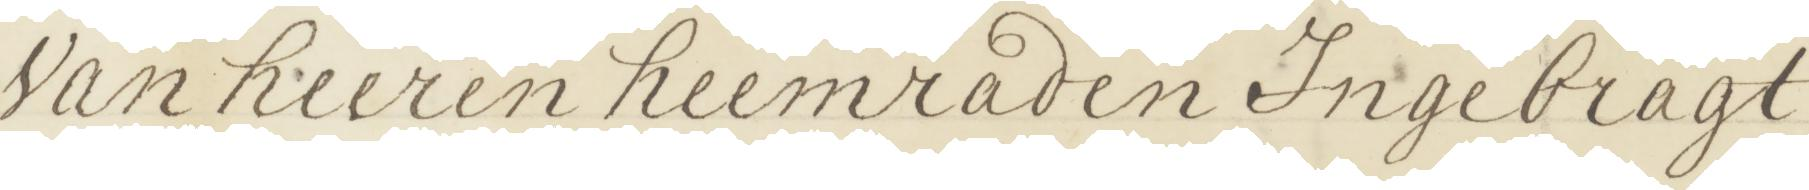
van heeren heemraden Ingebragt
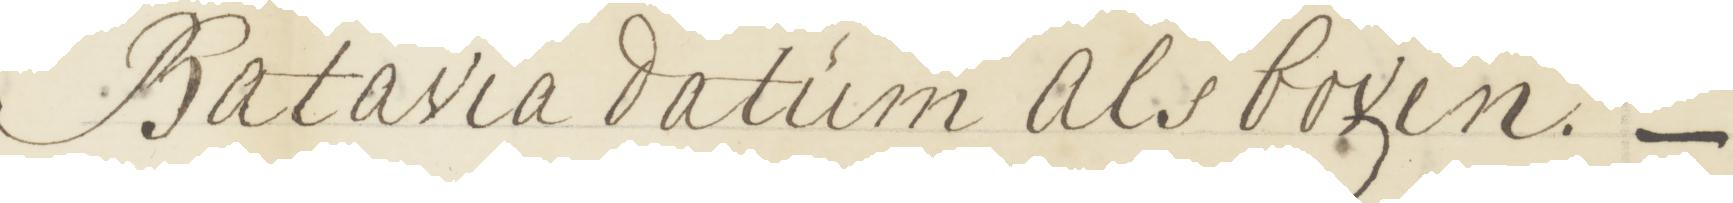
Batavia datum als boven. _
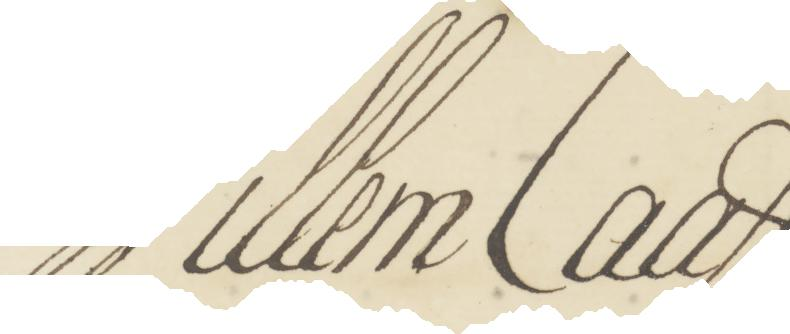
Willem Caaff
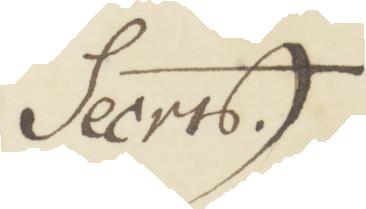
Secrts.
